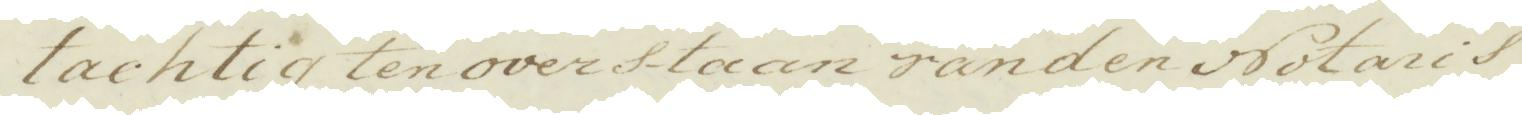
tachtig ten overstaan van den Notaris
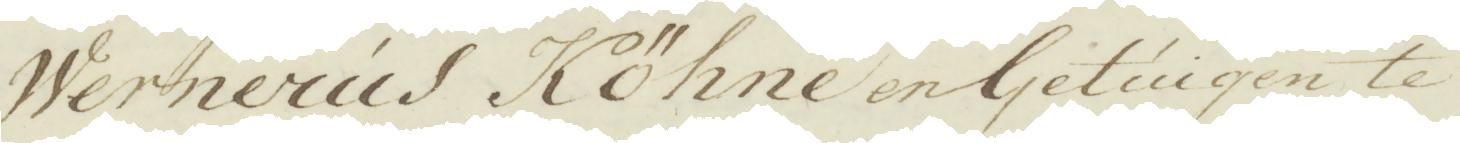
Wernerus Köhne en Getuigen te
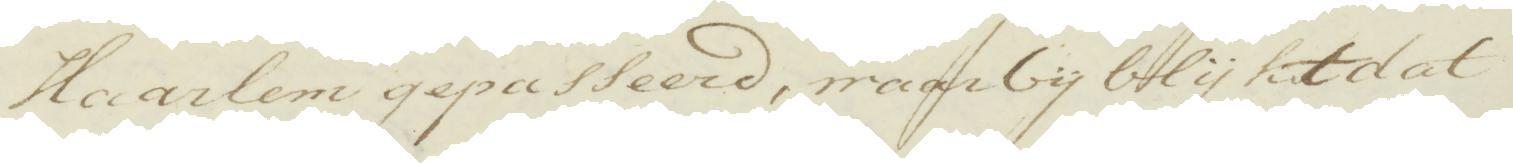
Haarlem gepasseerd, waar bij blijkt dat
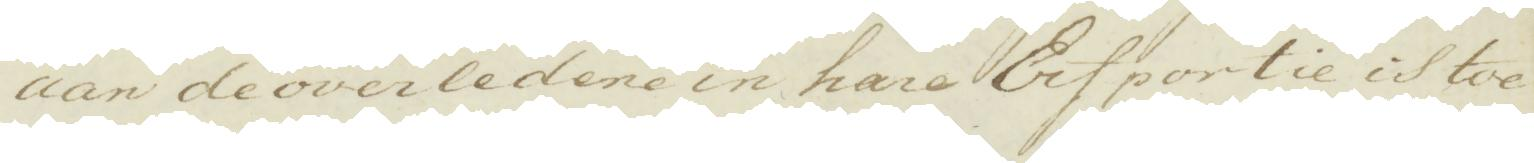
aan de overledene in hare Erfportie is toe
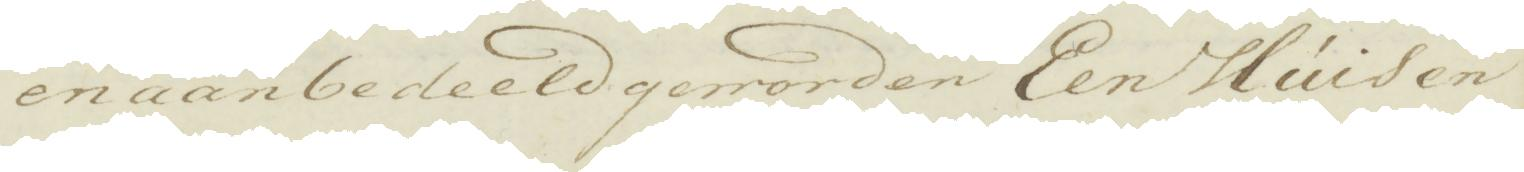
en aan bedeeld geworden Een Huis en
